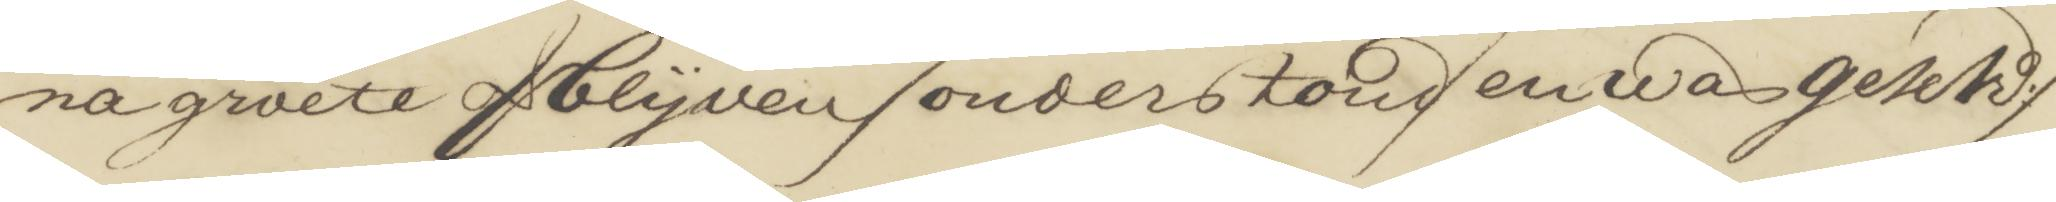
na groete verblijven /onderstond /en was getek„'./
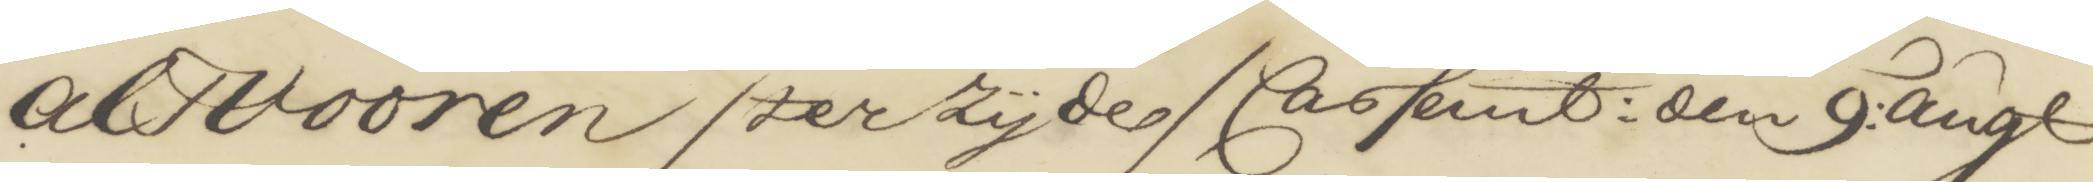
alsvooren / ter zijde/ Cassemb: den 9:' aug
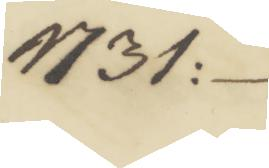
1731:
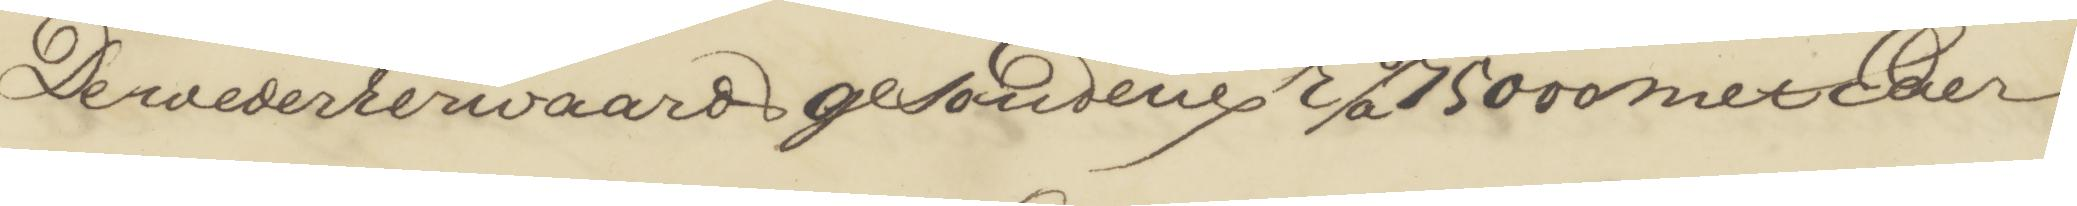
De wederherwaards gesondene r:o/a 75000 met haer
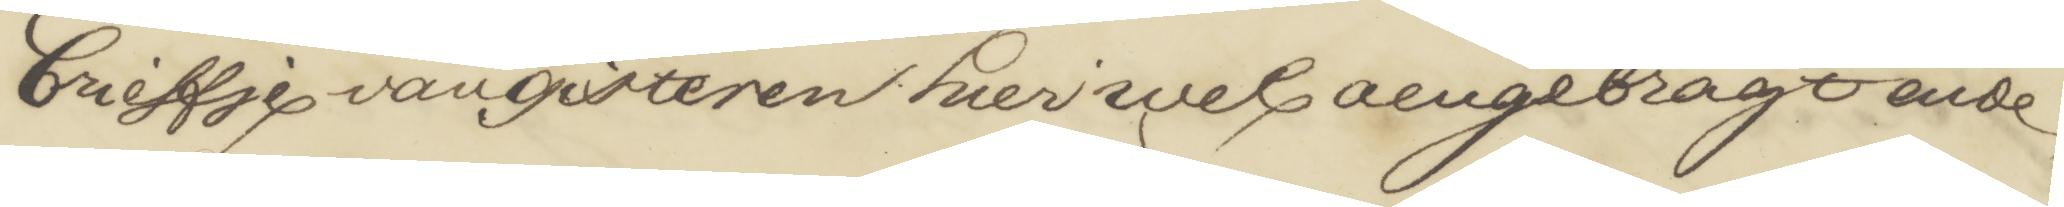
brieffje van gisteren hier wel aengebragt ende
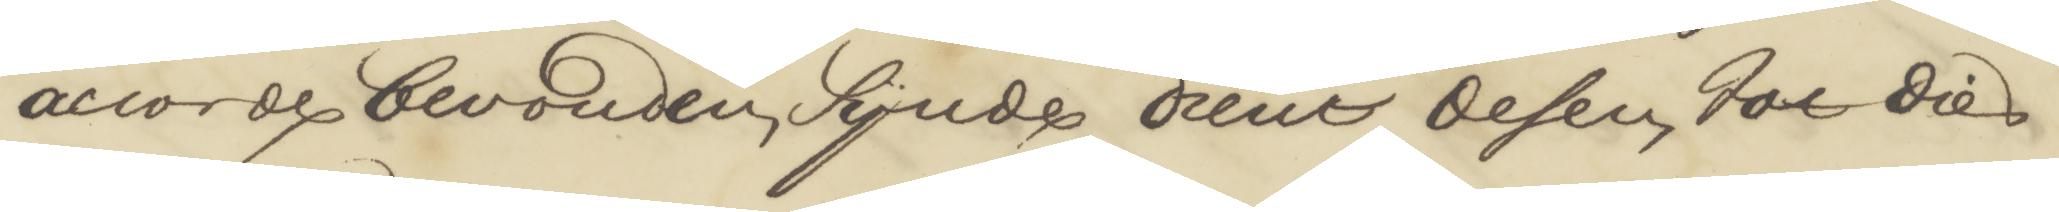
accorde bevonden Sijnde dient desen tot die
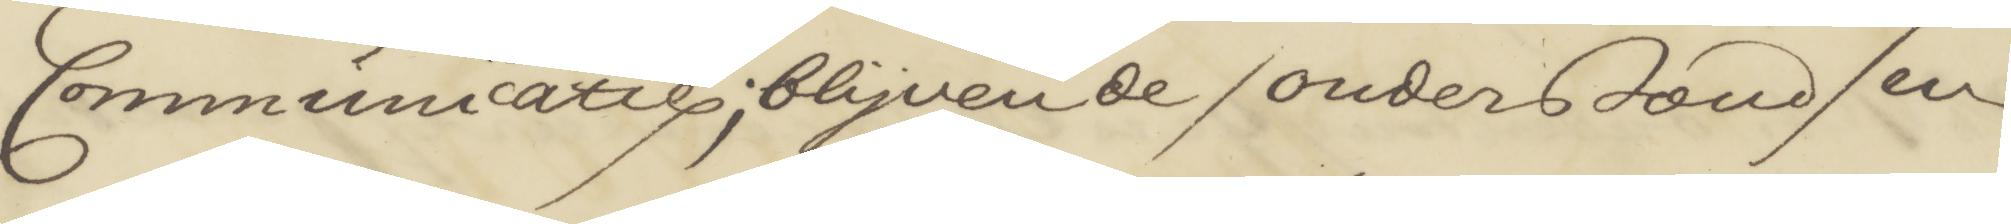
Communicatie; blijvende /onderstond / en
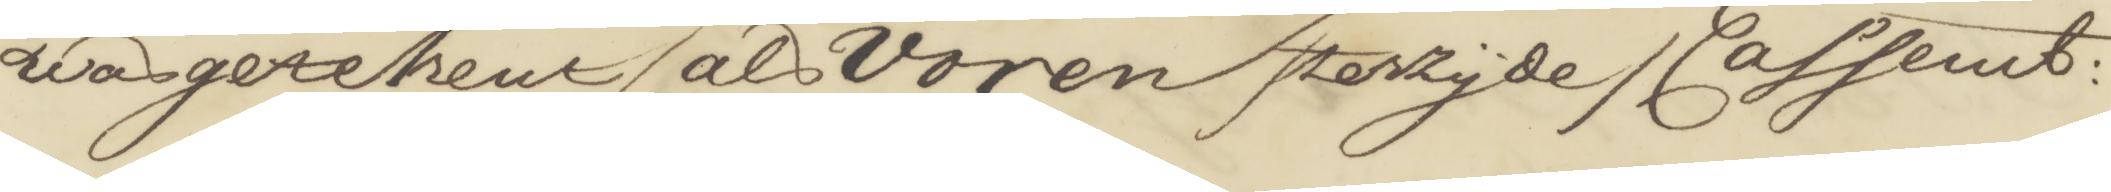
was getekent / als voren / terzijde/ Cassemb:
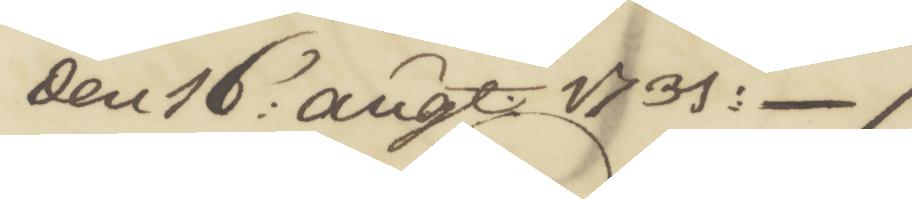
den 16:' aug= 1731:
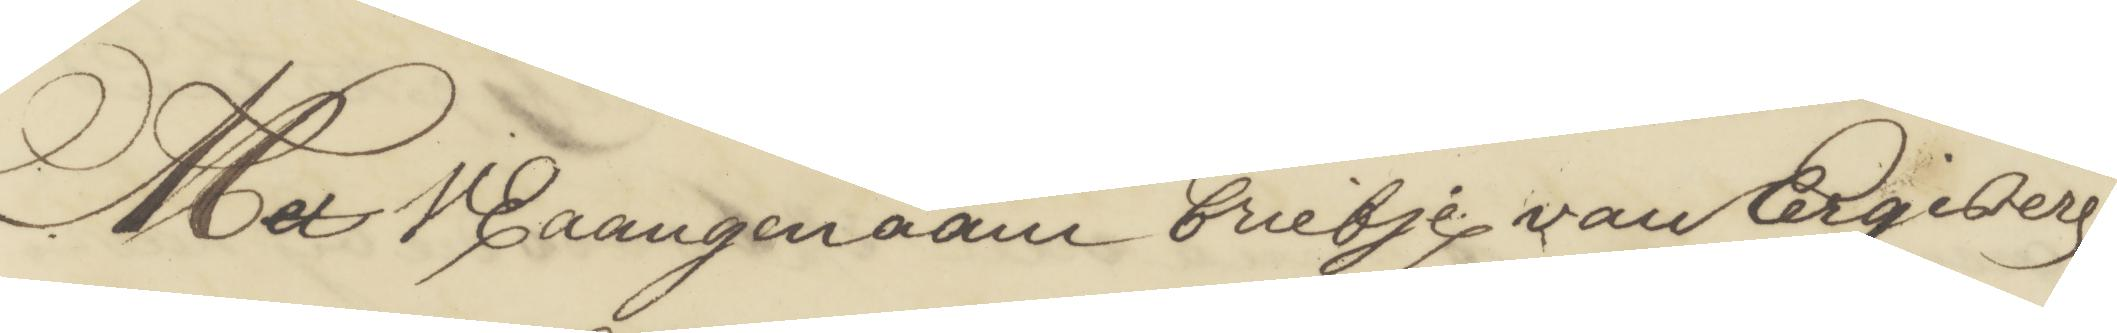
Met VE aangenaam briefje van Eergisteren
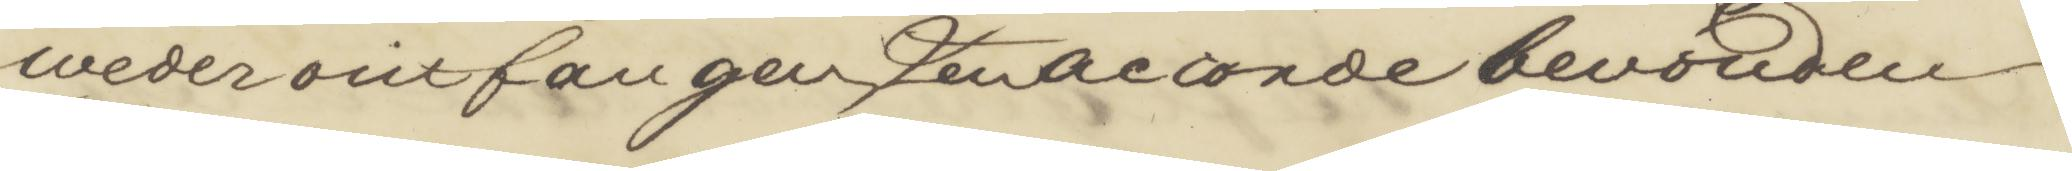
weder ontfangen ten accorde bevonden
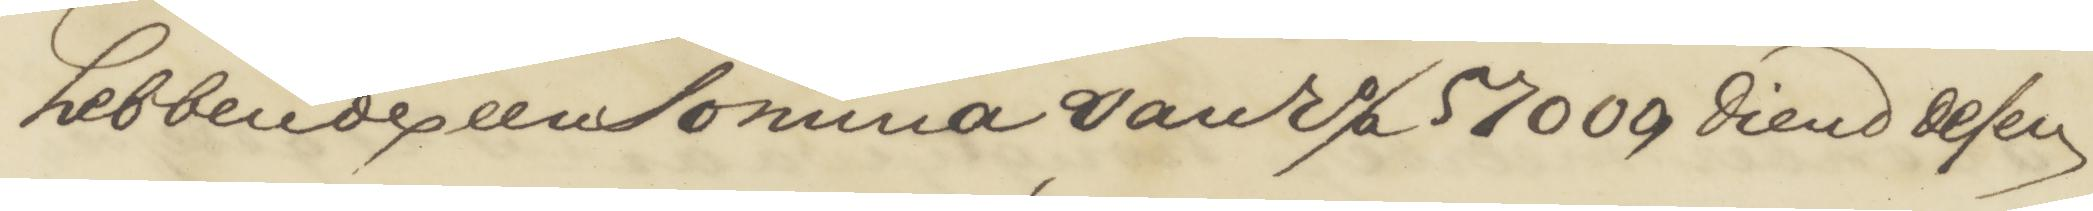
hebbende een somma van r:o/a 57000, diend desen
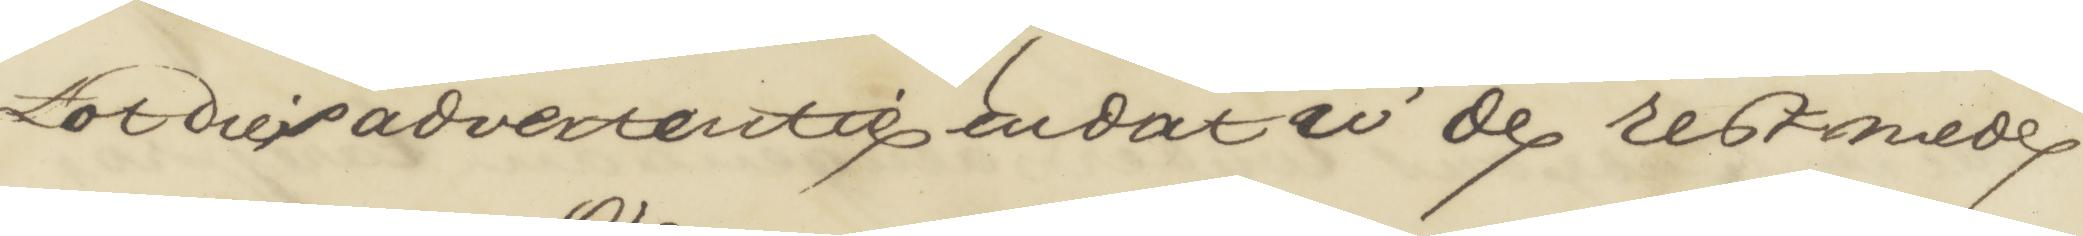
tot dies advertentie en dat w' de rest mede
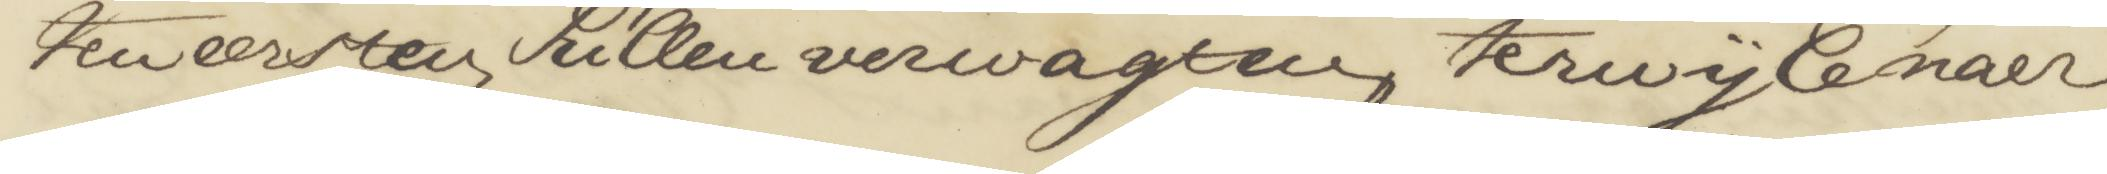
ten eersten, Sullen verwagten, terwijle naer
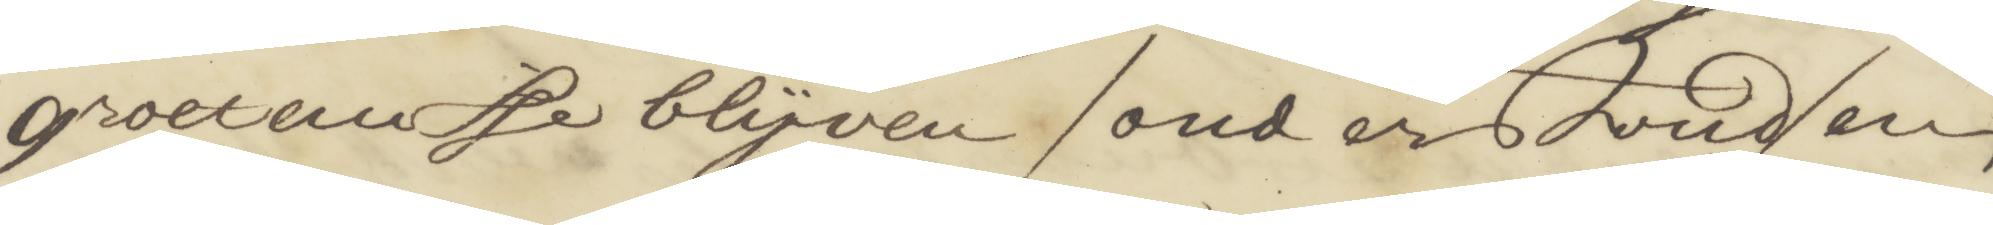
groetenisse blijven / onderstond/ en
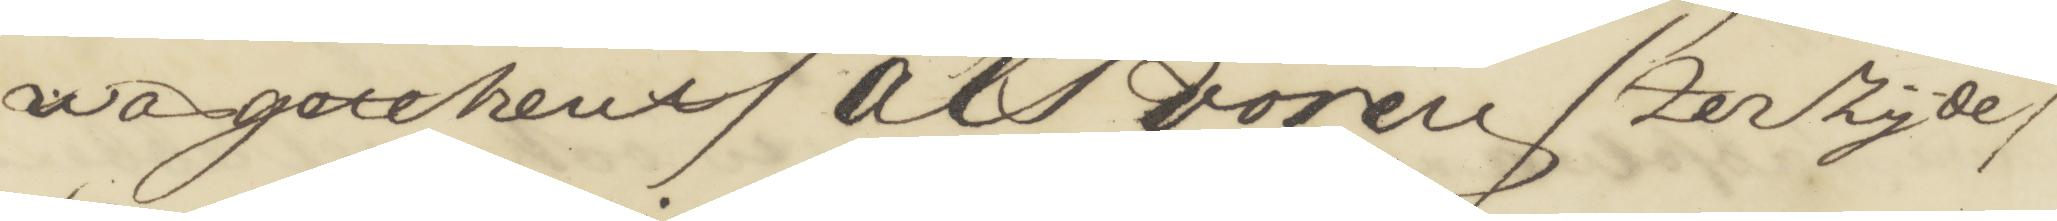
was getekent/ als voren / ter Zijde /
